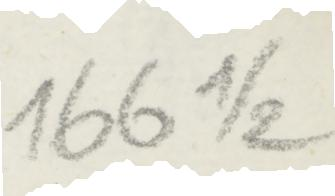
166 ½
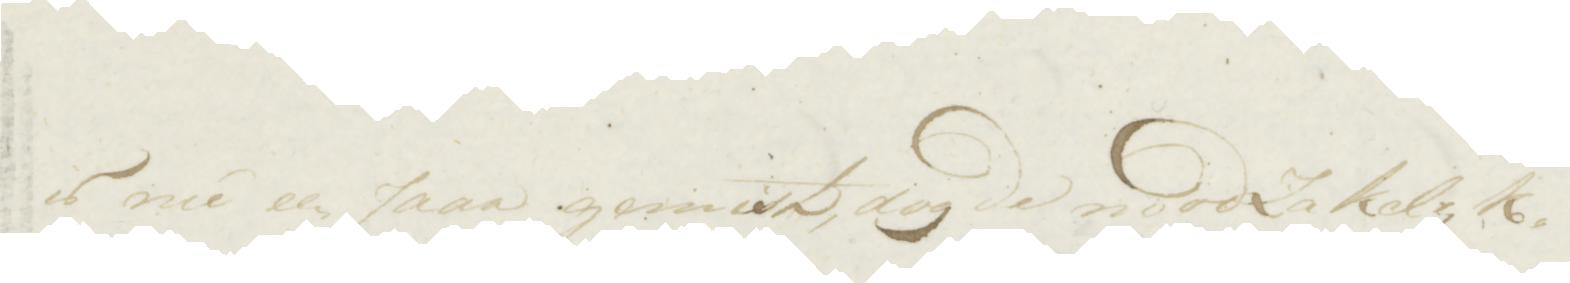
is nu een Jaar gemist, dog de noodzakelyk„
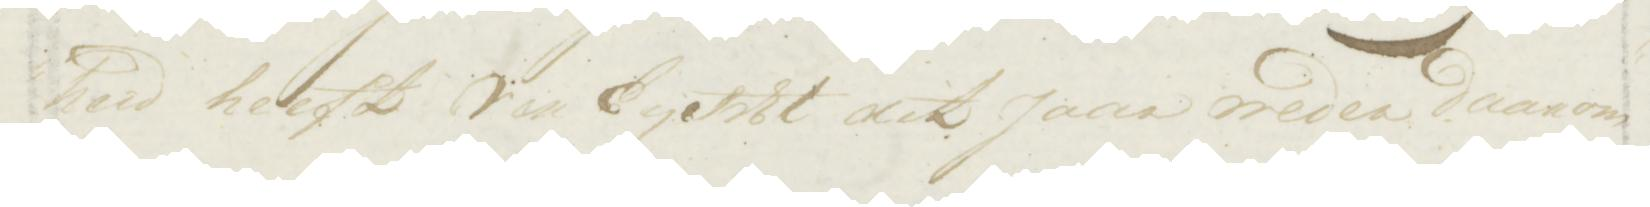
heid heeft ver Eijscht dit Jaar weder daarom
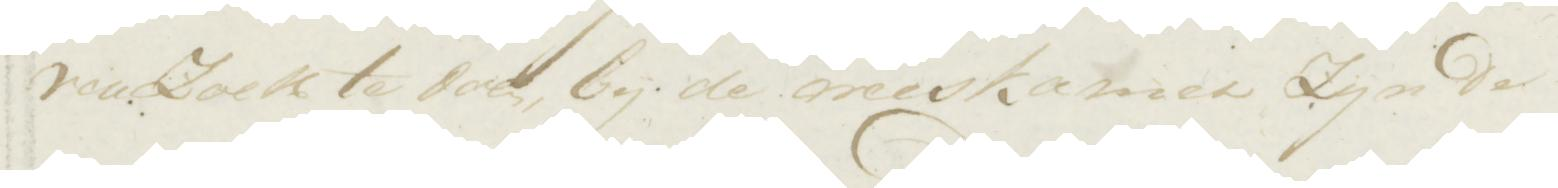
verzoek te doen, bij de weeskamer zijn de
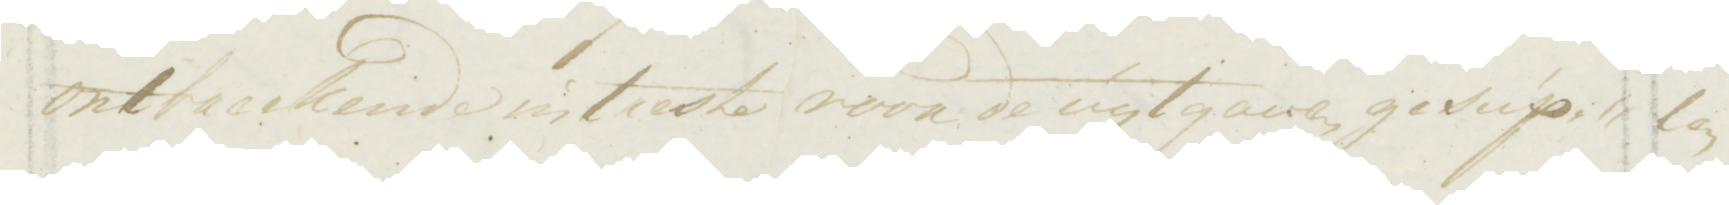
ontbreekende intresse voor de uijtgaven gesup, „ len
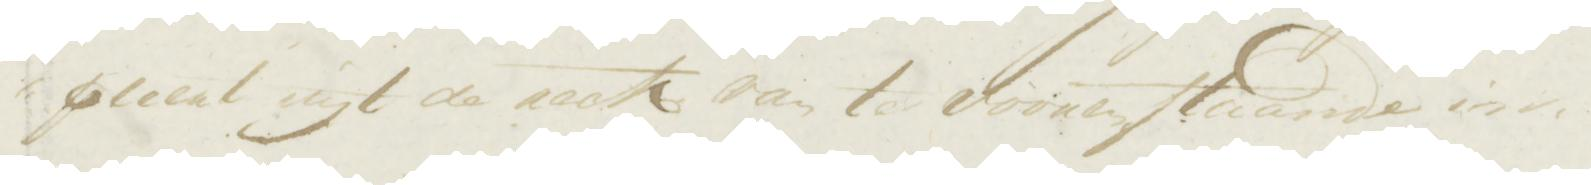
„pleert uijt de reck van te vooren staande in„
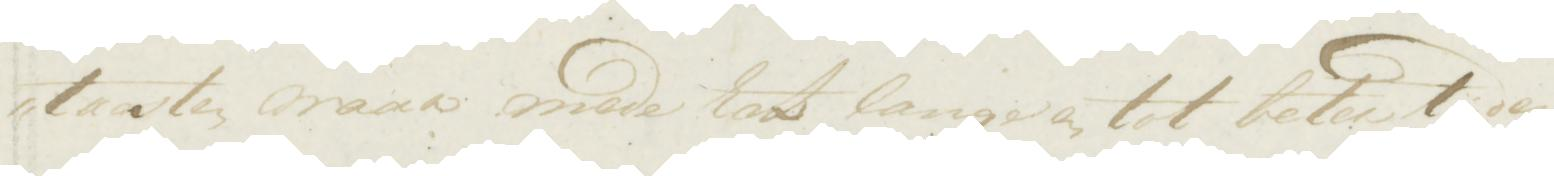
„tresten waar mede het lange en tot beter tijde
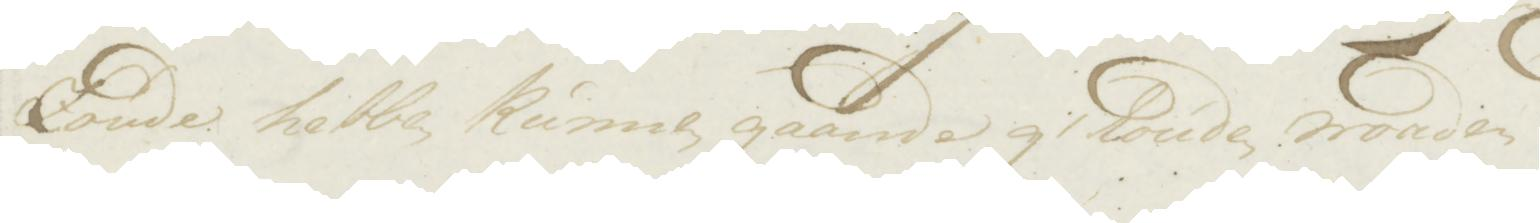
zonder hebben kunnen gaande g'houde worden
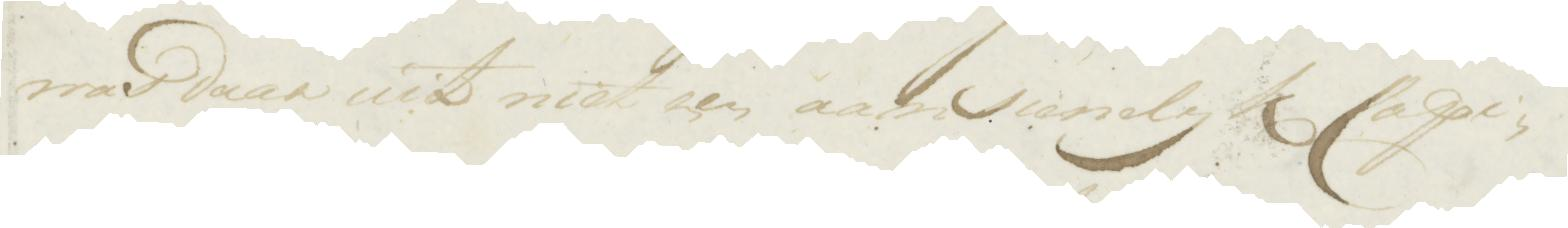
was daar uit niet een aansienelyk Capi„
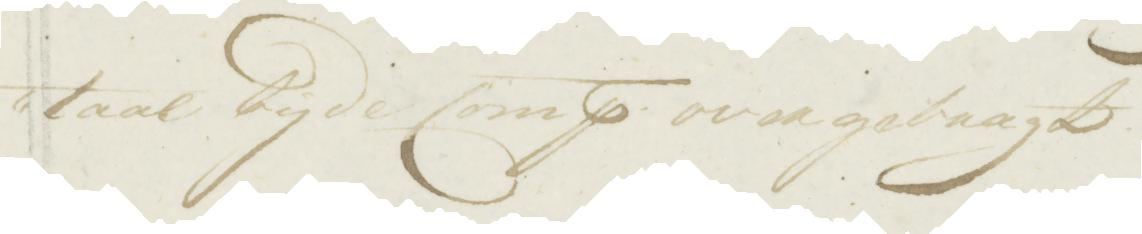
taal bij de Comp. overgebragt.
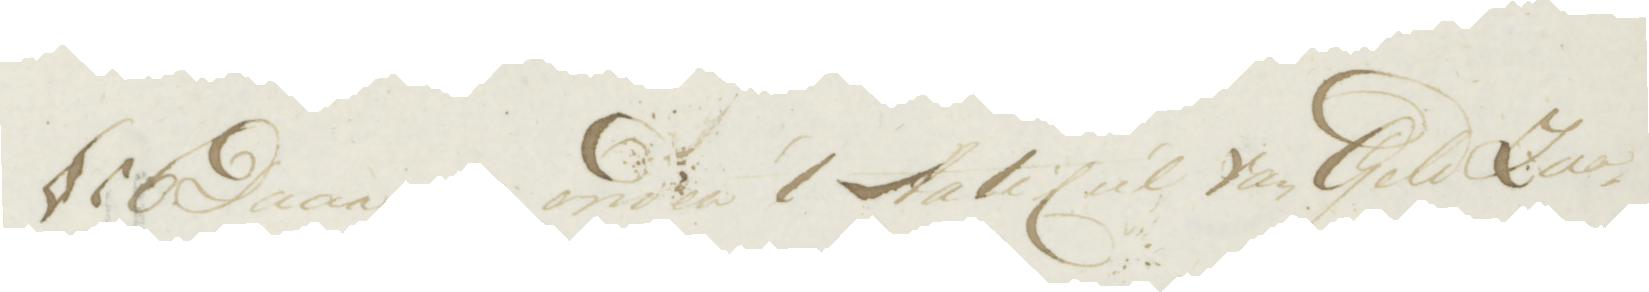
§ 56 Daar wij onder ’t Articul van Geld Zaa„
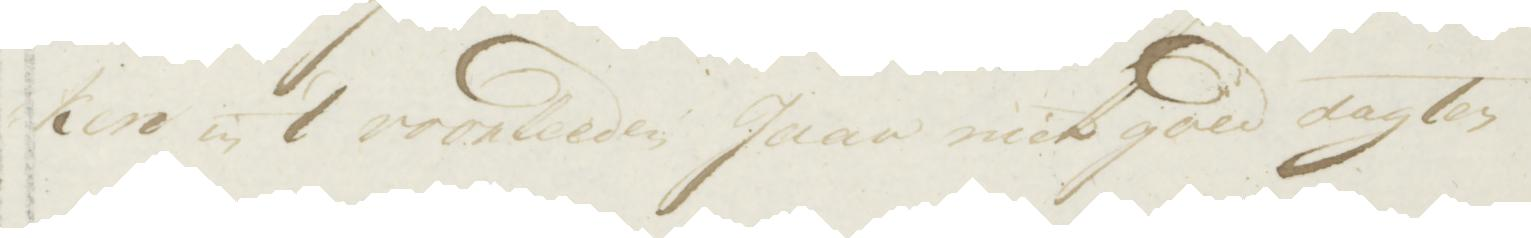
ken in 't voorleeden Jaar niet goed dagten
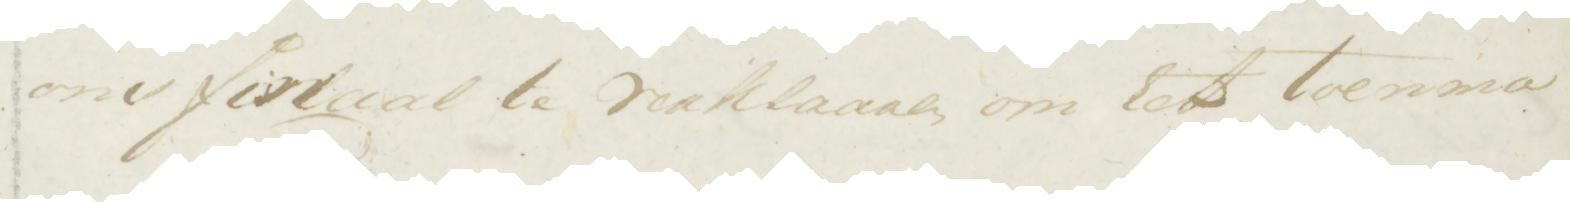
om fiscaal te verklaaren om het toenma
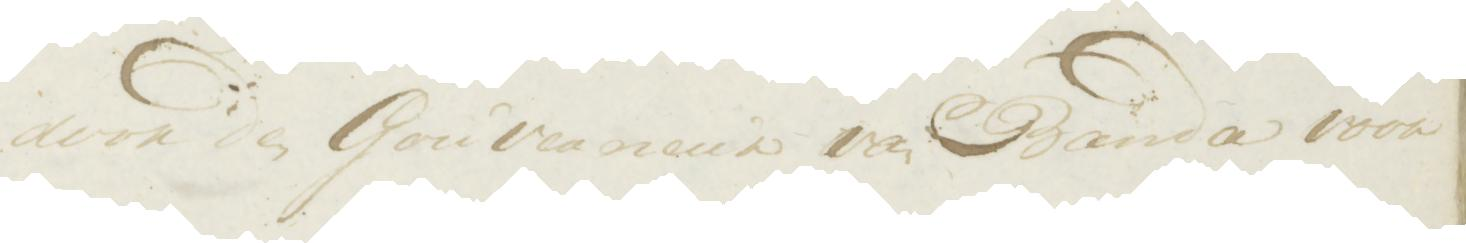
door den Gouverneur van Banda voor
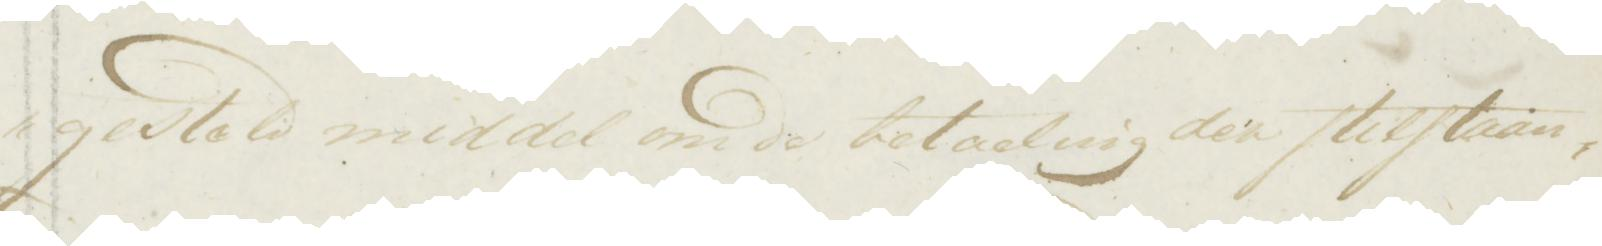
„gesteld middel om de betaeling der stilstaan
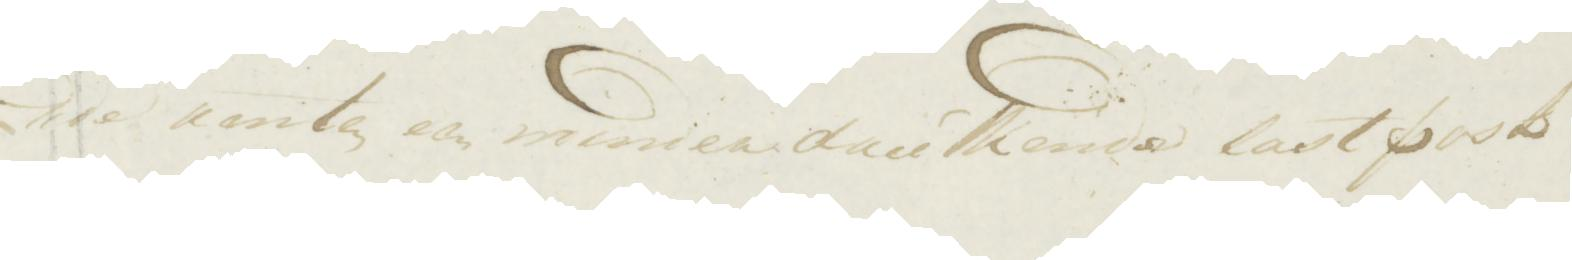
de renten en minder drukkende lastpost
